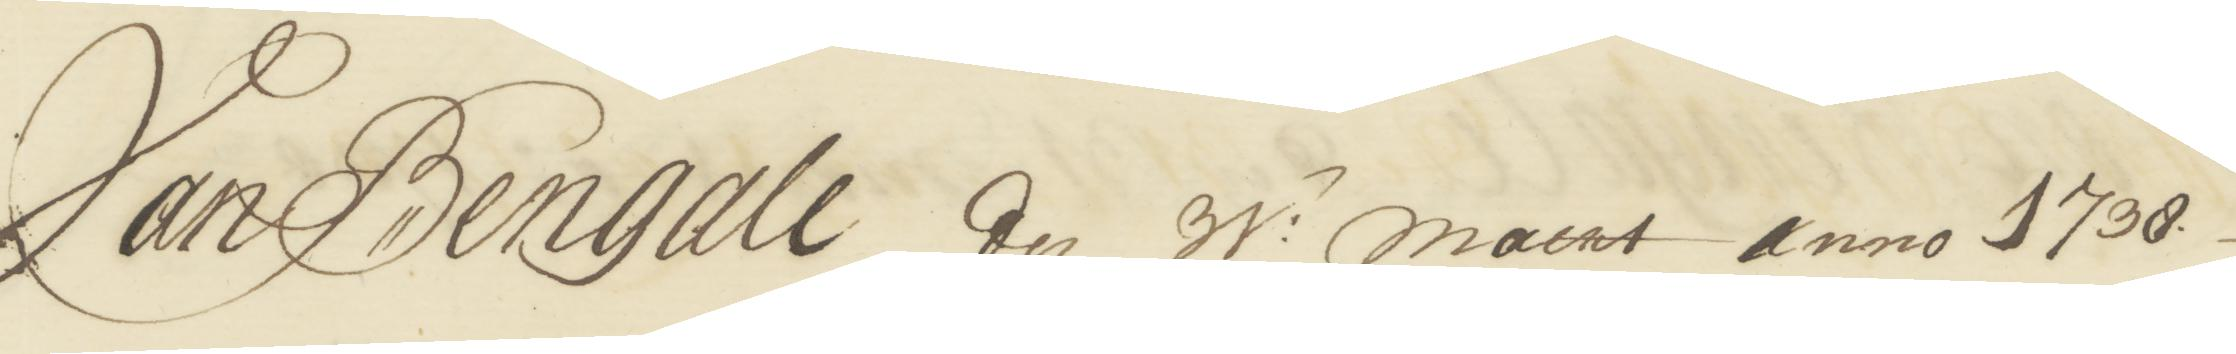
Van Bengale den 31:' maert anno 1738.
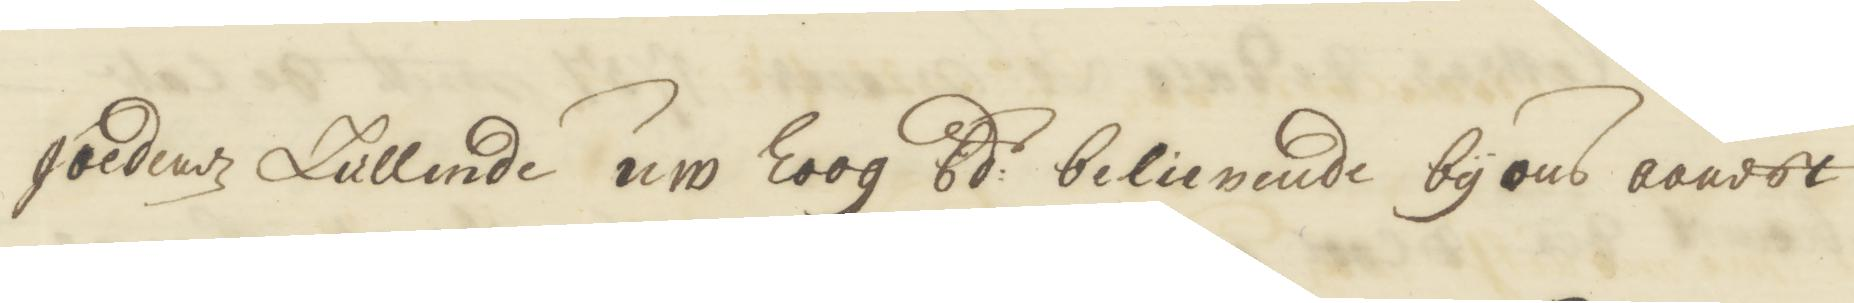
goederen zullende uw hoog Ed:s believende bij ons arrest
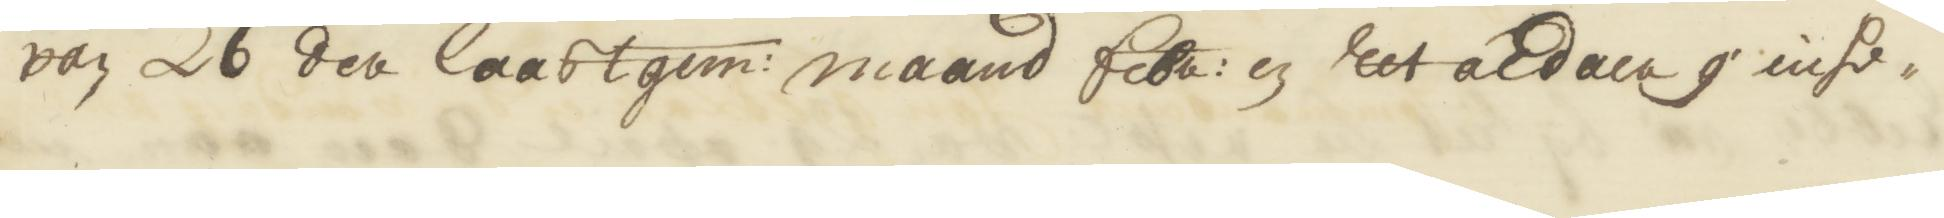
van 26 der laastgem: maand febr: en het aldaer g’inse„
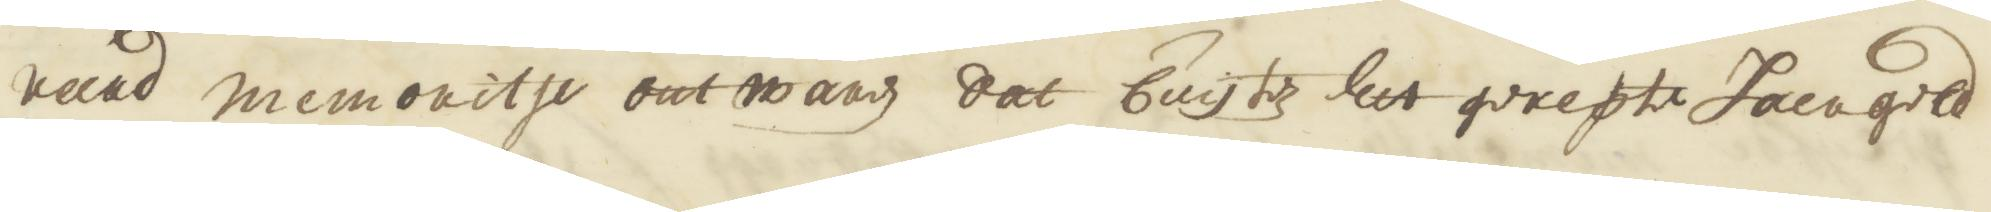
reerd memoritje ontwaren dat buijten het gerepte Iaergeld
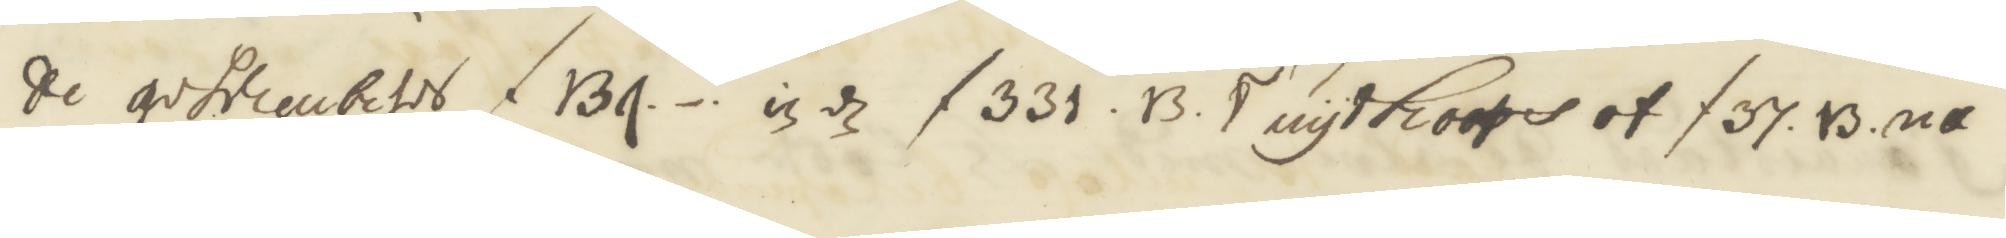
de geschenkjes ƒ134. – . in en ƒ331. 13. t' uijtkoops of ƒ37.13. na
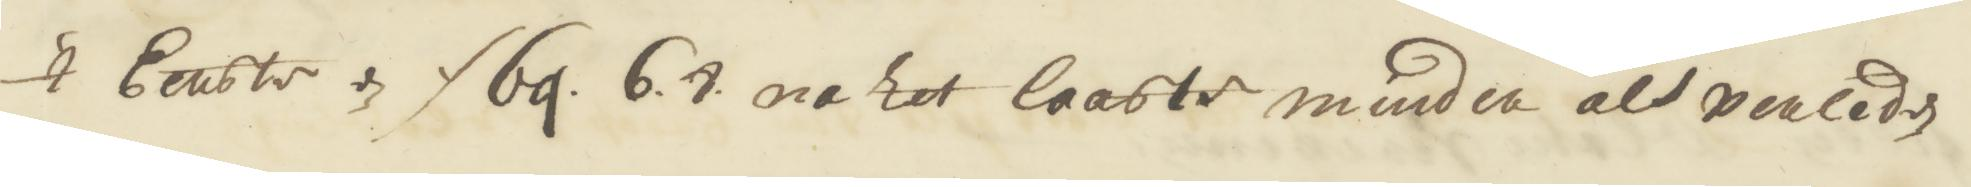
't Eerste en ƒ64: 6. 8. na het laaste minder als verleden
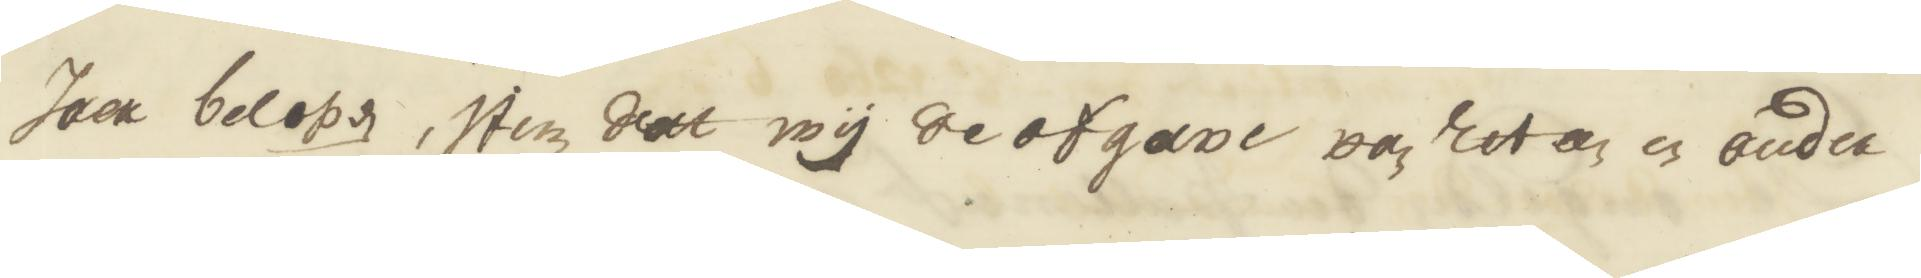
Jaar belopen, jtem dat wij de afgave van het een en ander
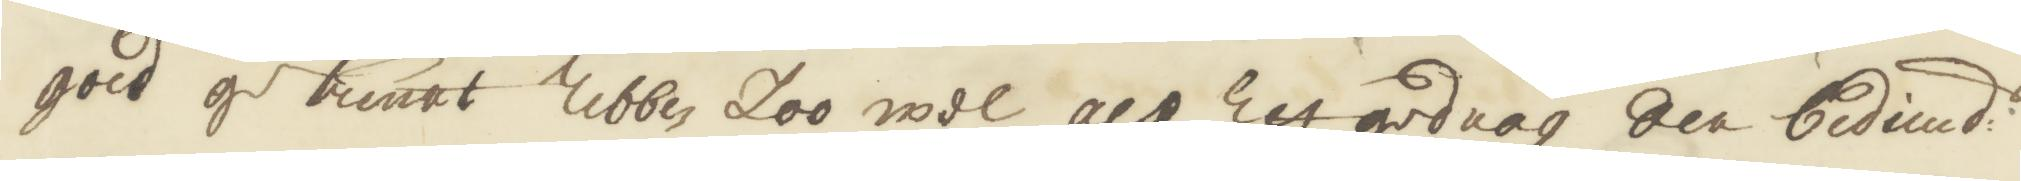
goed gekeurt hebben zoo wel als het gedrag der bediend:s
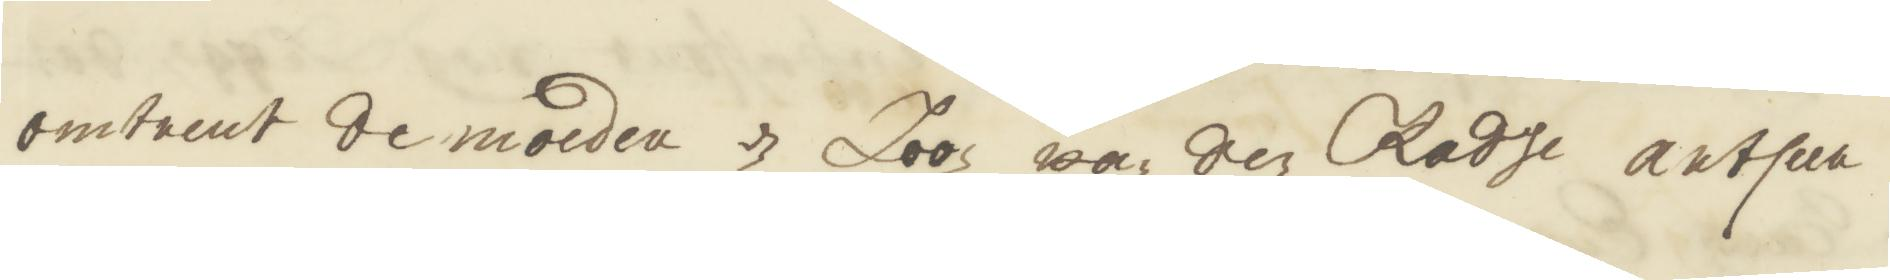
omtrent de moeder en zoo van den Radje artseer
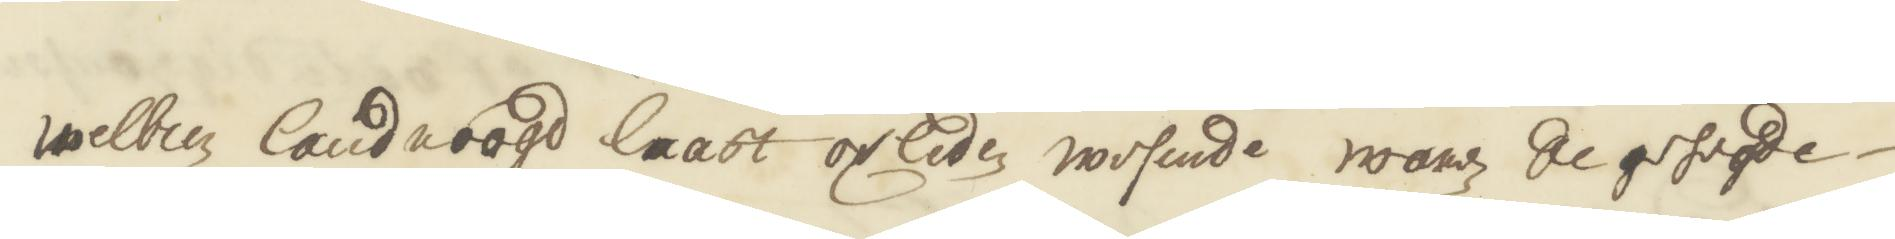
welken landvoogd laast overleden wesende waren de gesegde
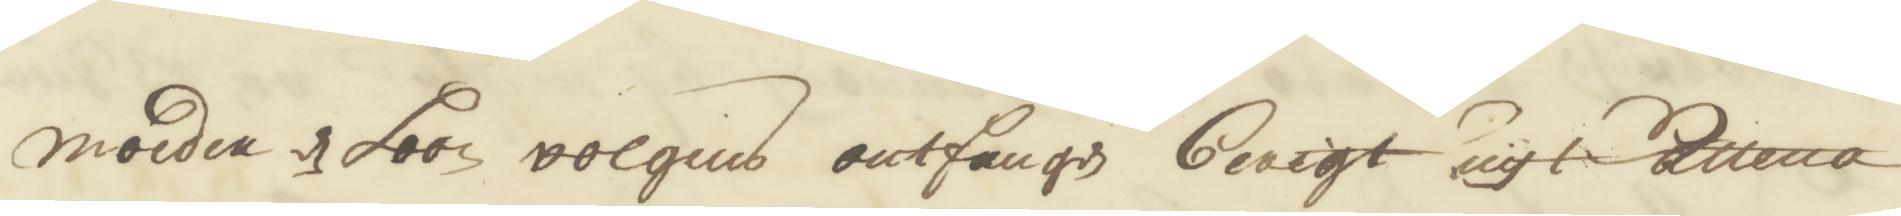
moeder en soon volgens ontfangen berigt uijt Pattena
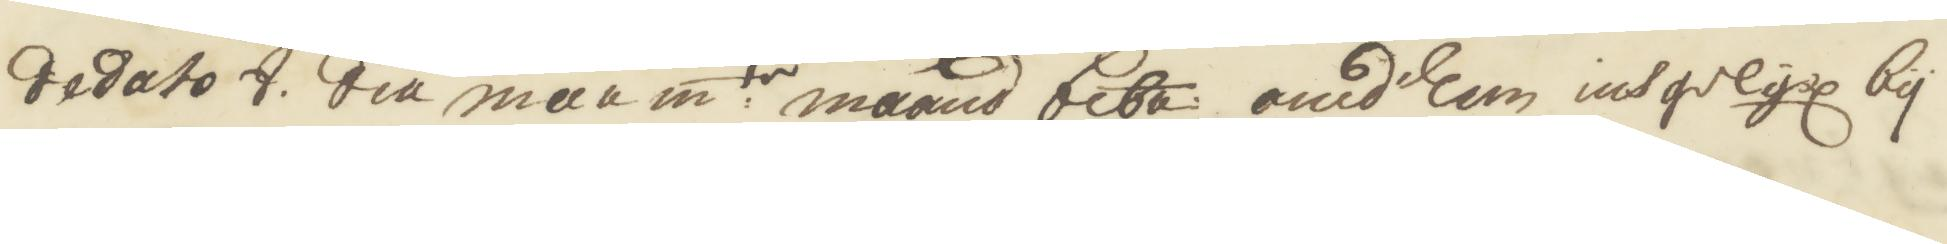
de dato 8. der meerm:te maand febr: om d' hem insgelijx bij
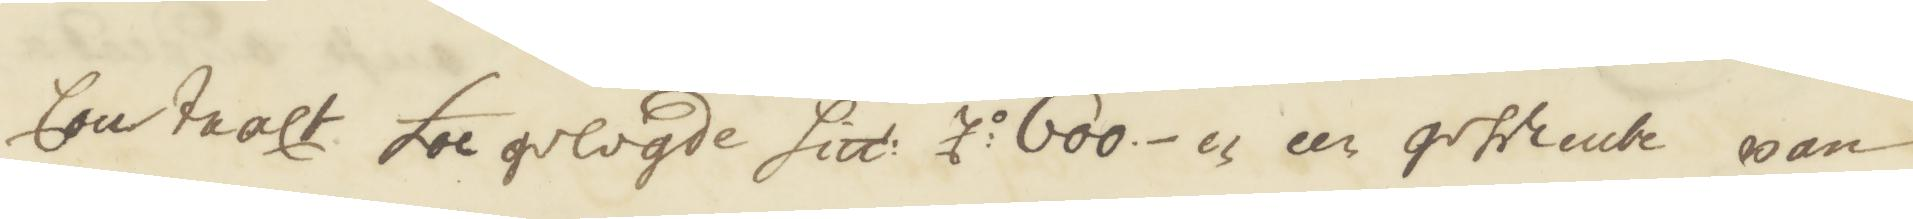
Contract toe gelegde sicc: r:o 600. – en een geschenk van
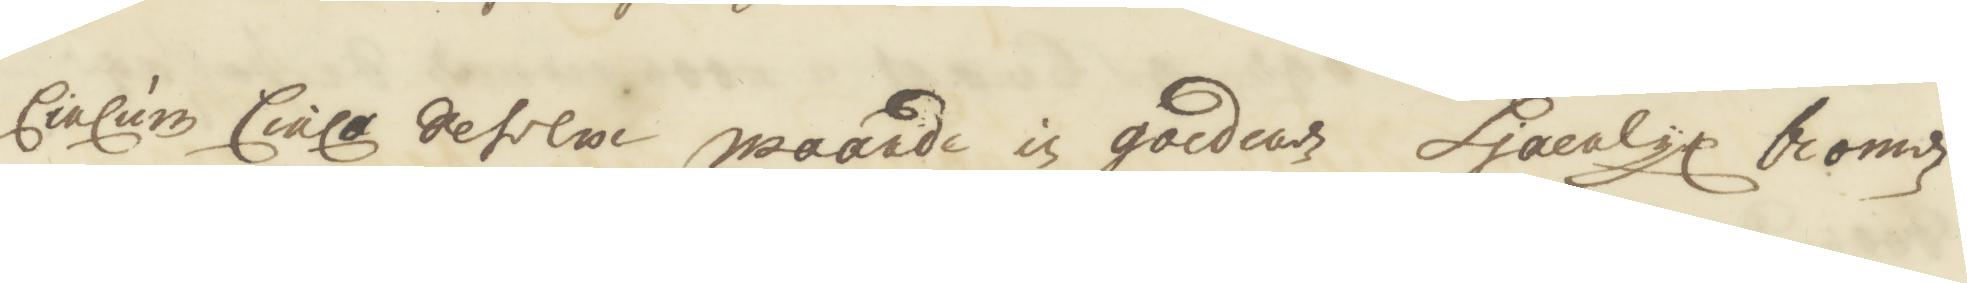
Circum Circa deselve waarde in goederen sjaerlijx komen
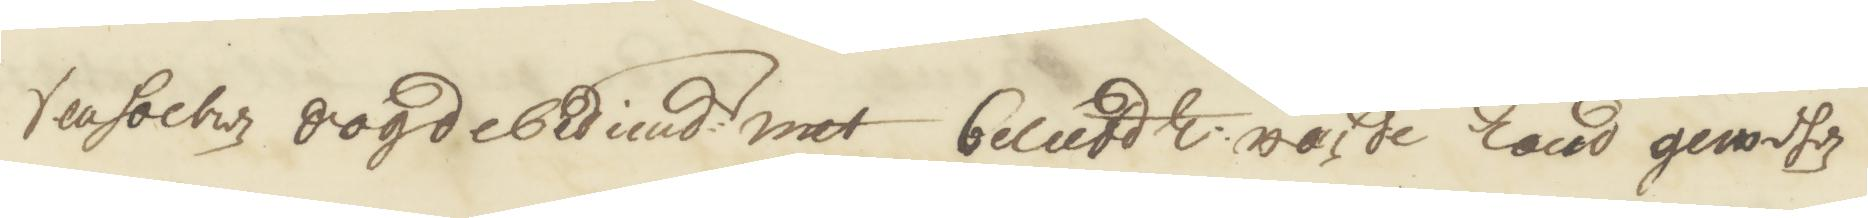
versoeken dog de bediend:s met beleefdh: vande hand gewesen
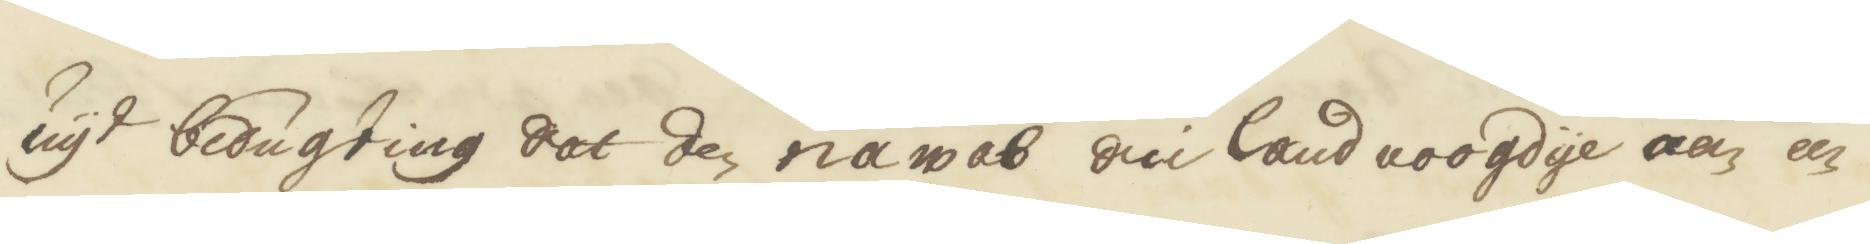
uijt bedugting dat den nawab die land voogdije aan een
